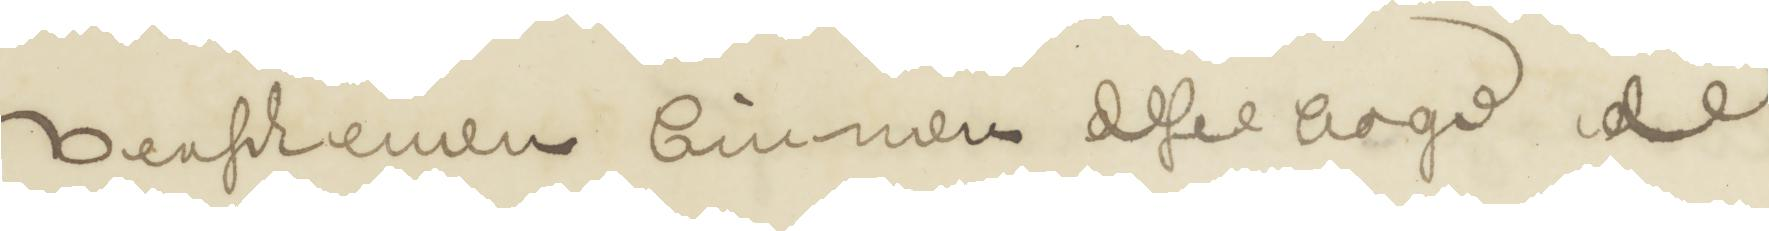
verschenen binnen dese loge de
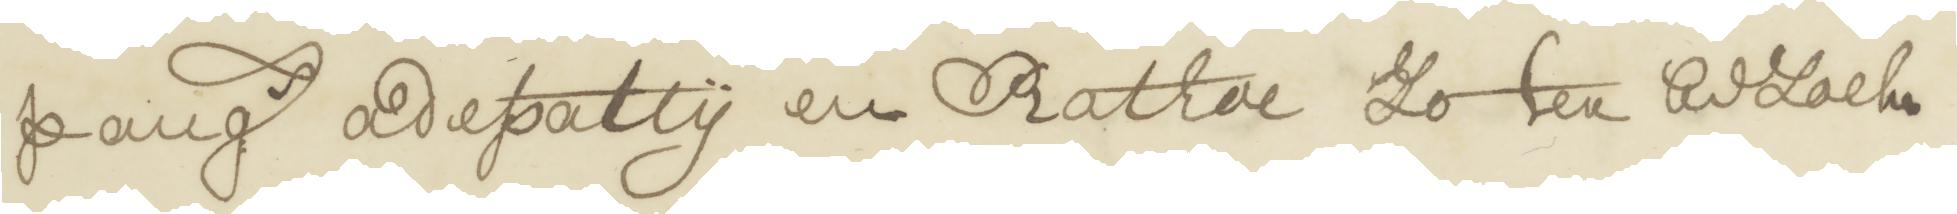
pang:s adepattij en Rathoe zo ter bezoek
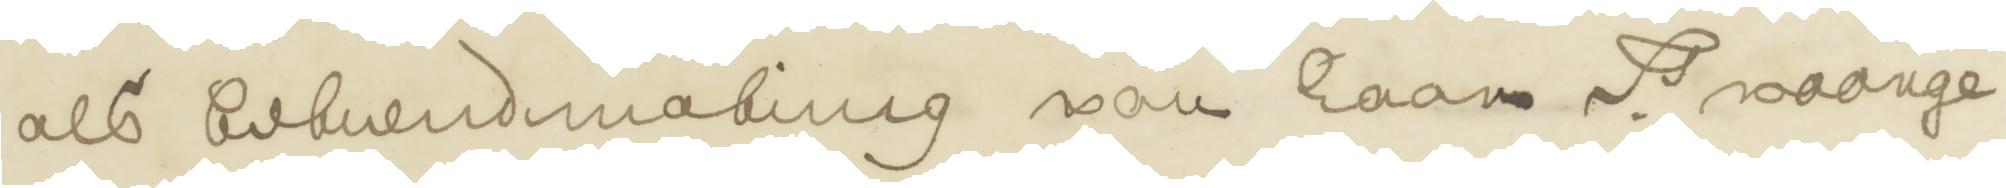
als bekendmaking van haar E.s voorge
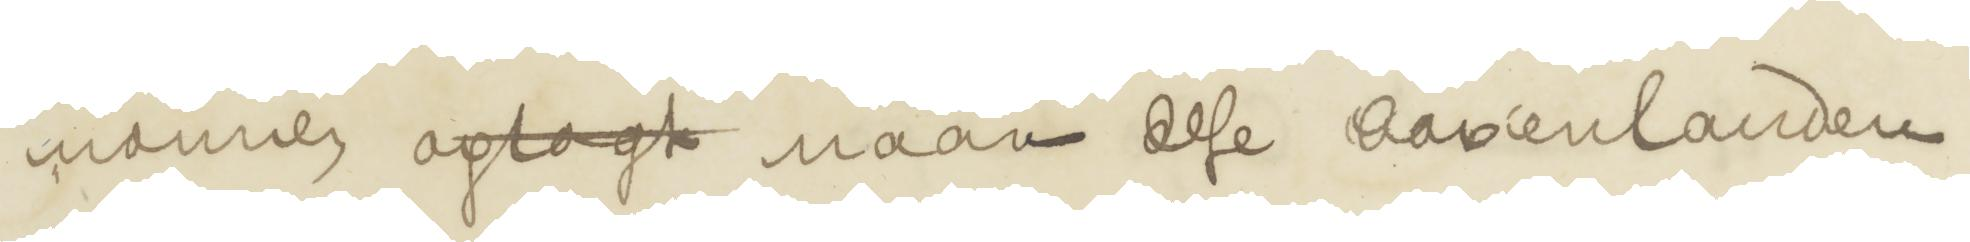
nomen optogt naar dese bovenlanden
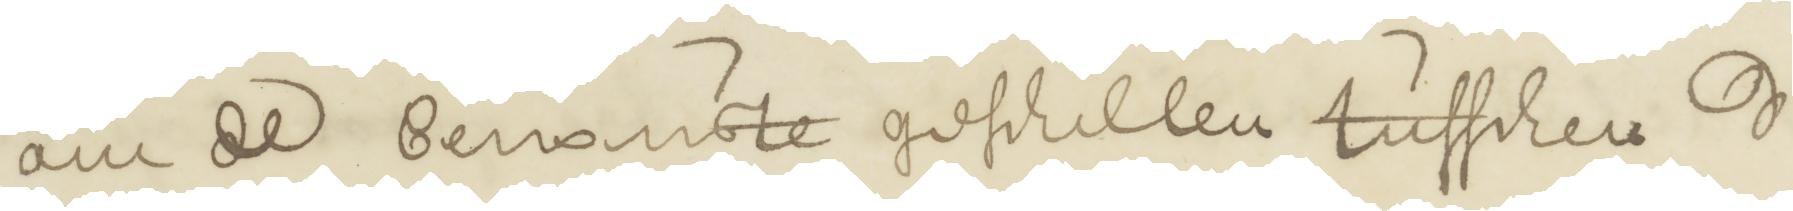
om de bewuste geschillen tusschen d
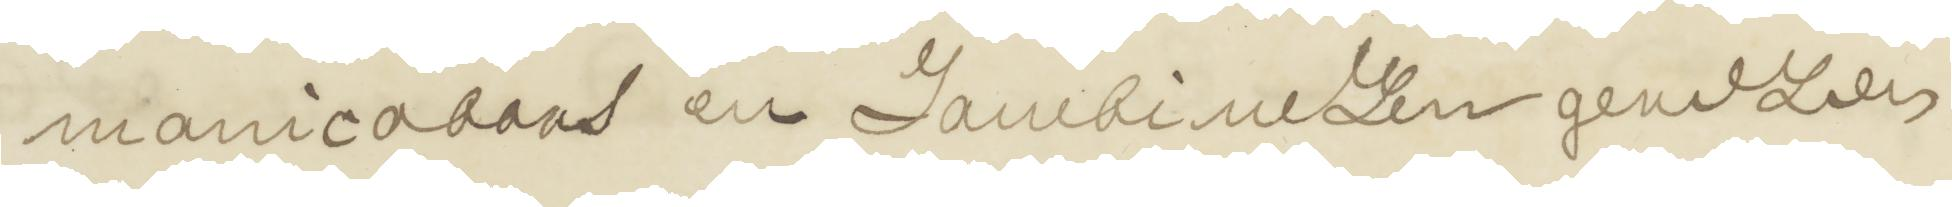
manicabars en Jambinezen genezen
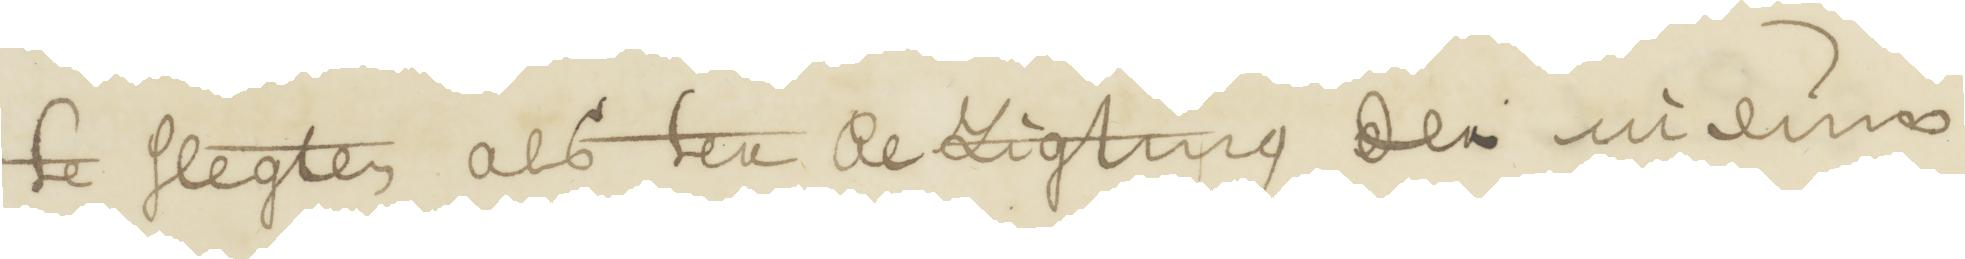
te slegten als ter bezigting der nieuw
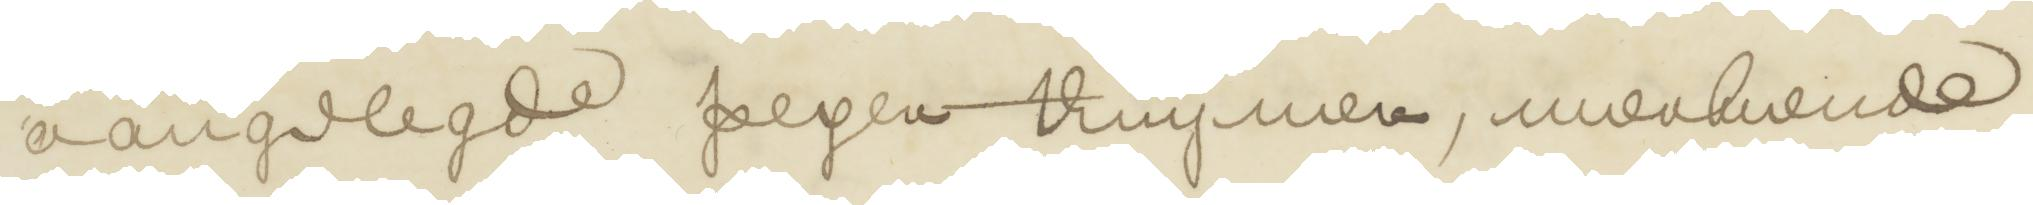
aangelegde peper thuijnen, merkende
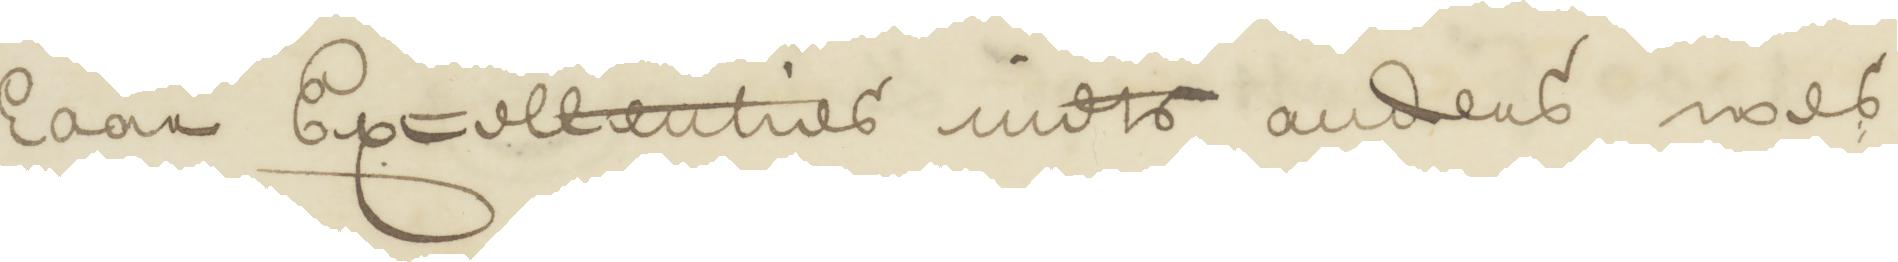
haar Excellenties niets anders wes„
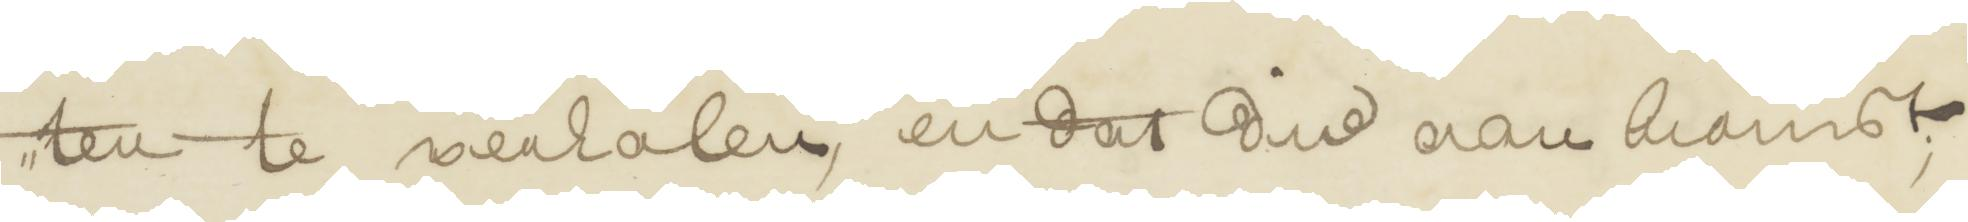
„ten te verhalen, en dat die aankomst;
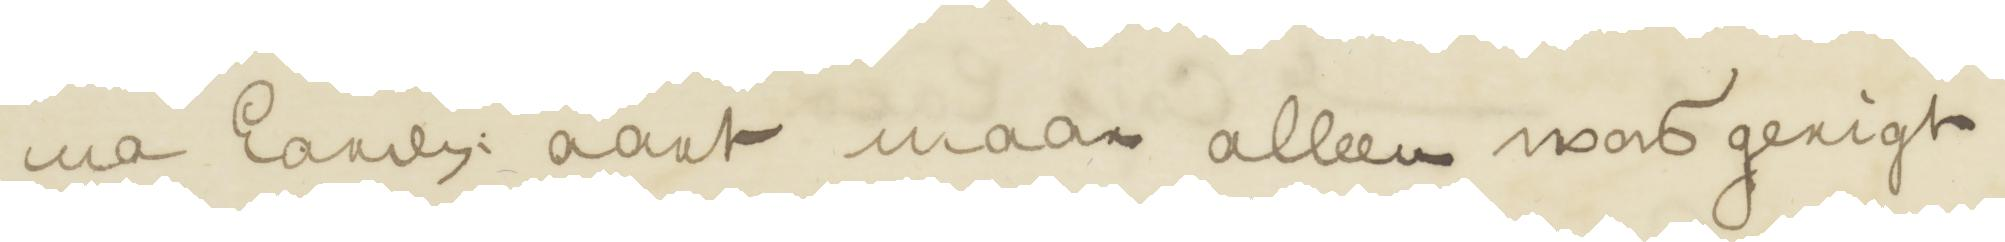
na haren; aart maar alleen was gerigt
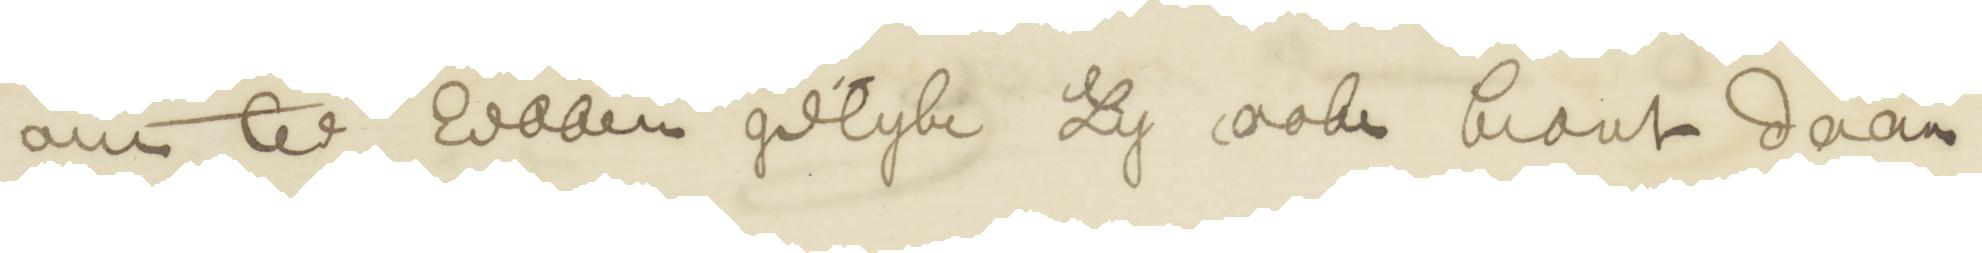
om te hebben gelijk zij ook kort daar
